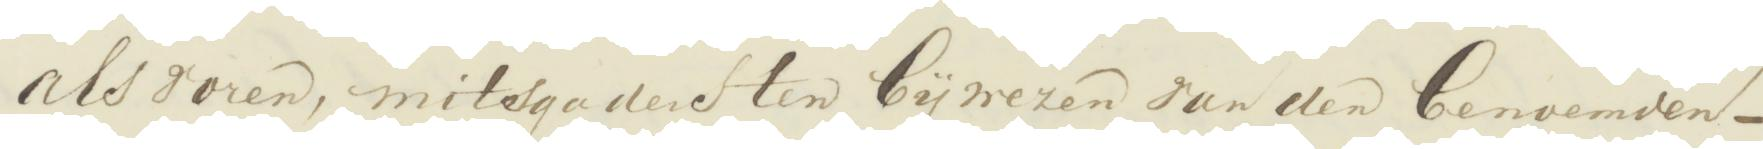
als voren, mitsgaders ten bij wezen van den benoemden-
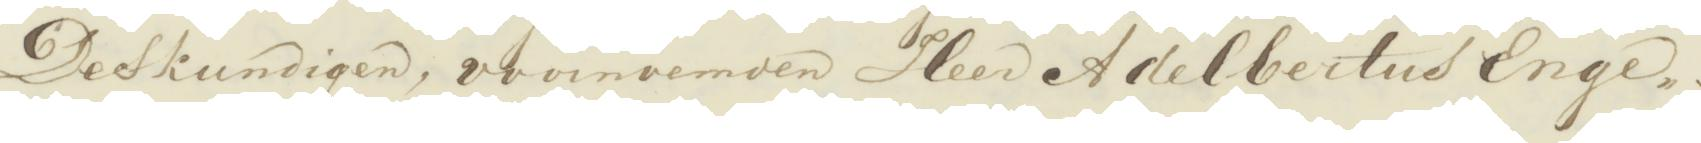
Deskundigen, voornoemden Heer Adelbertus Enge„
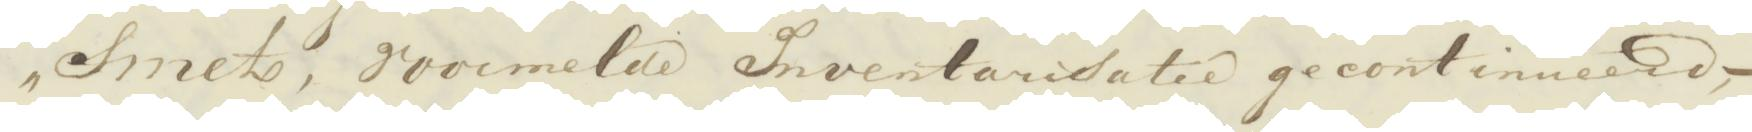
„ smet, voormelde Inventarisatie gecontinueerd,
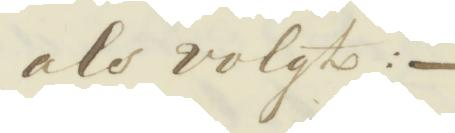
als volgt:—
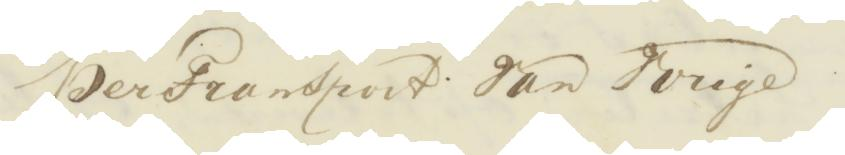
per Transport van Vorige
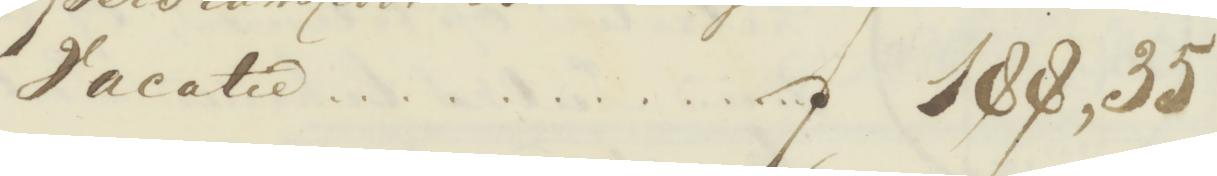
Vacatie . . . . . . . . . . . . . ƒ 188,35
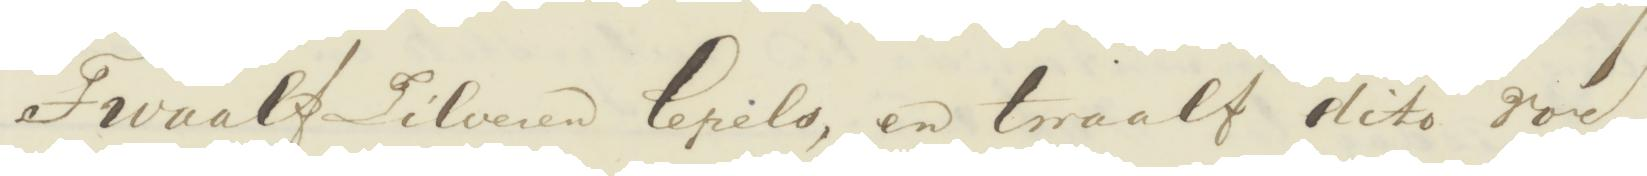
Twaalf zilveren lepels, en twaalf dito vor
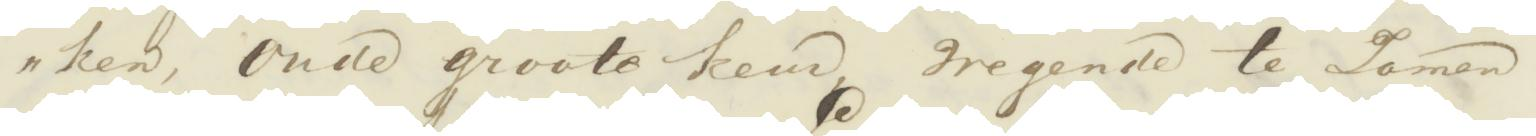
„ken, oude groote keur, wegende te zamen
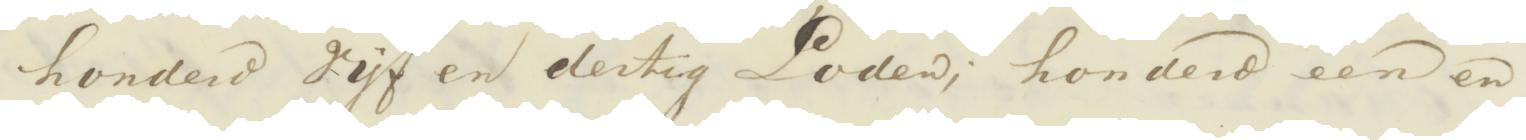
honderd vijf en dertig Loden; honderd een en
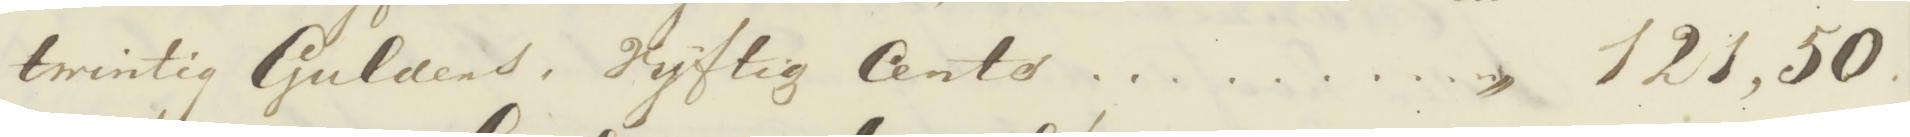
twintig Guldens, Vijftig Cents . . . . . . . . . . „ 121.50.
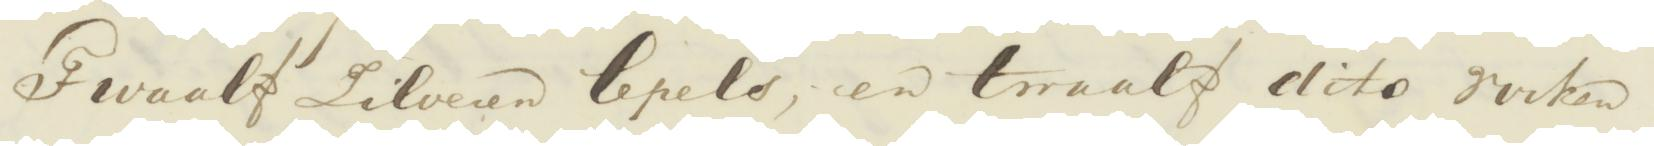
Twaalf zilveren lepels, en twaalf dito vorken
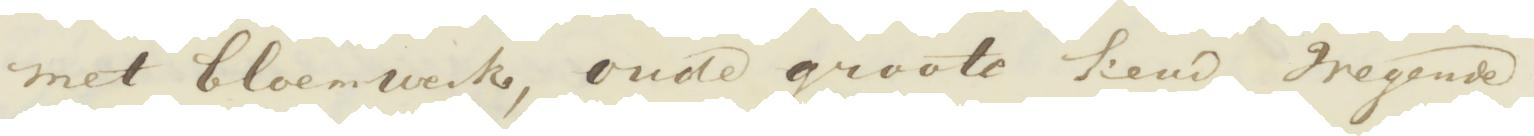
met bloemwerk, oude groote keur, wegende
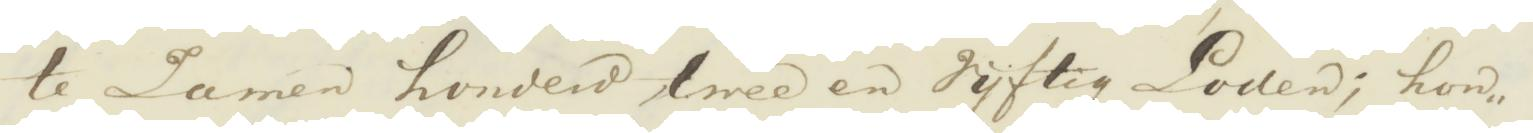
te zamen honderd twee en vijftig Loden; hon„
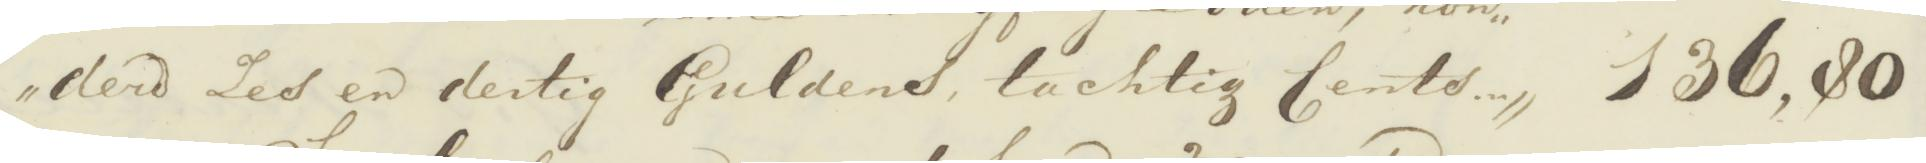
„derd zes en dertig Guldens, tachtig Cents...„ 136,80
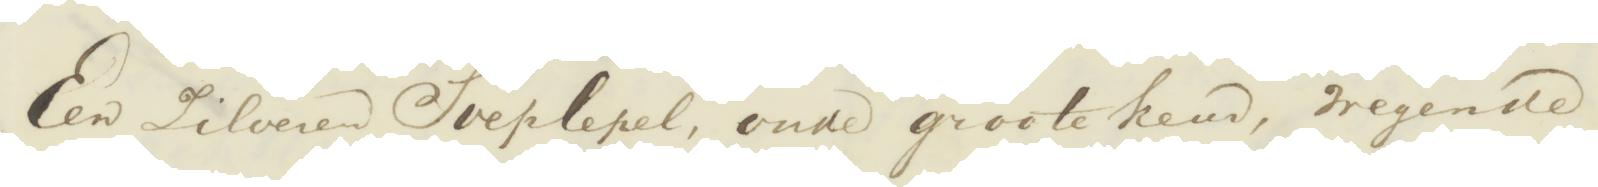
Een Zilveren soeplepel, oude groote keur, wegende
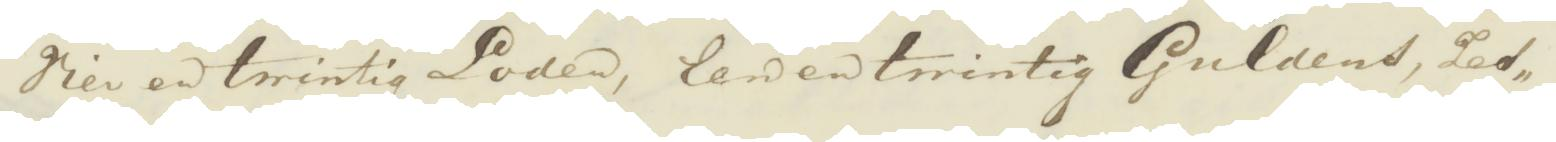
vier en twintig Loden, Een en twintig Guldens, zes„
